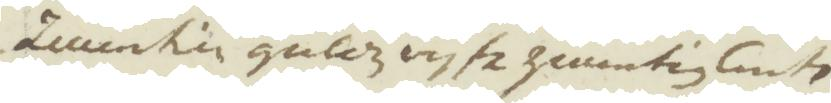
Zeventien gulden vyf en zeventig Cents
